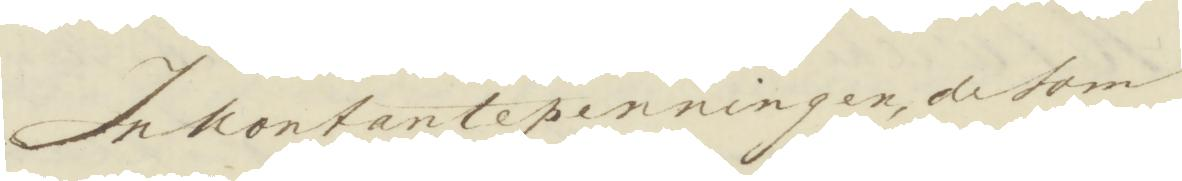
In kontante penningen, de som
